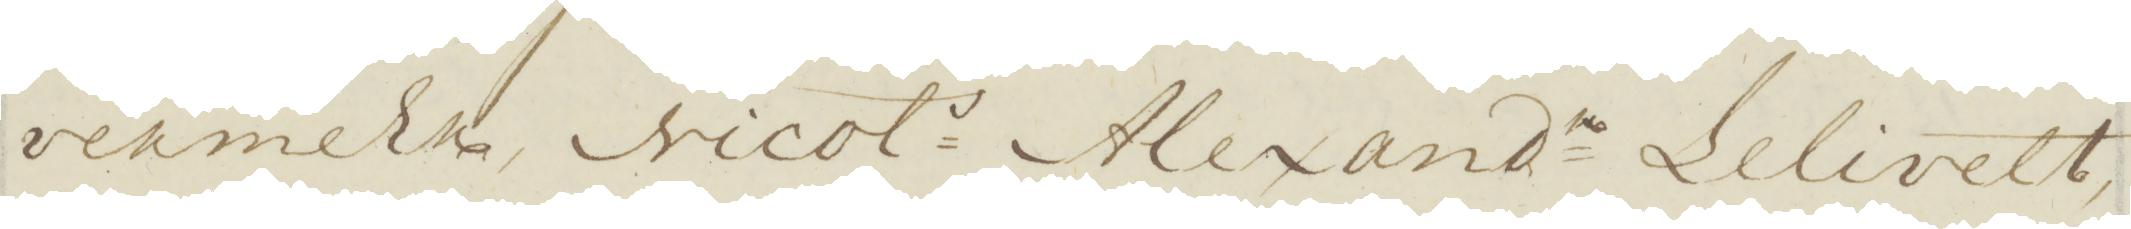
vermehr, Nicol=s Alexand=r Lelivelt,
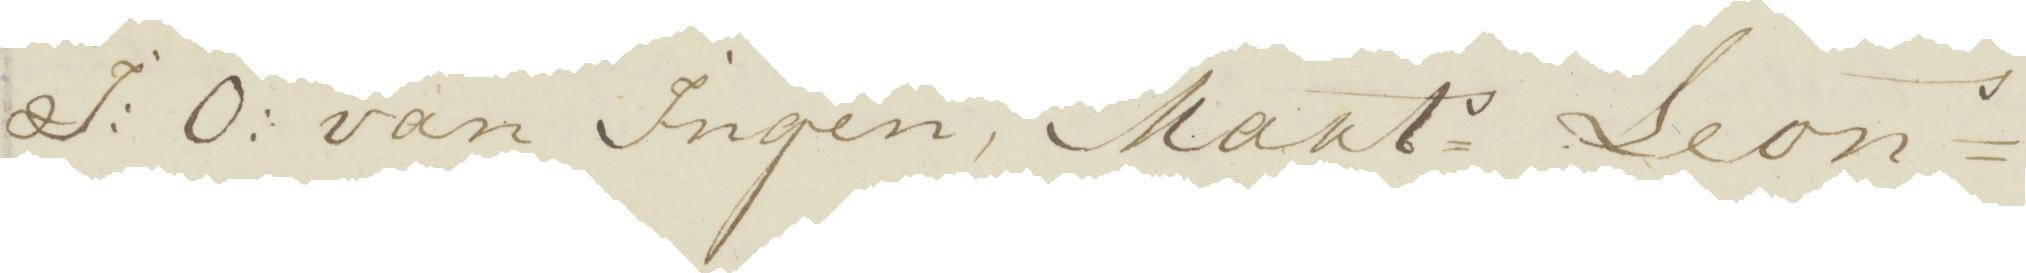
J: O: van Jngen, Mart=s Leon=s
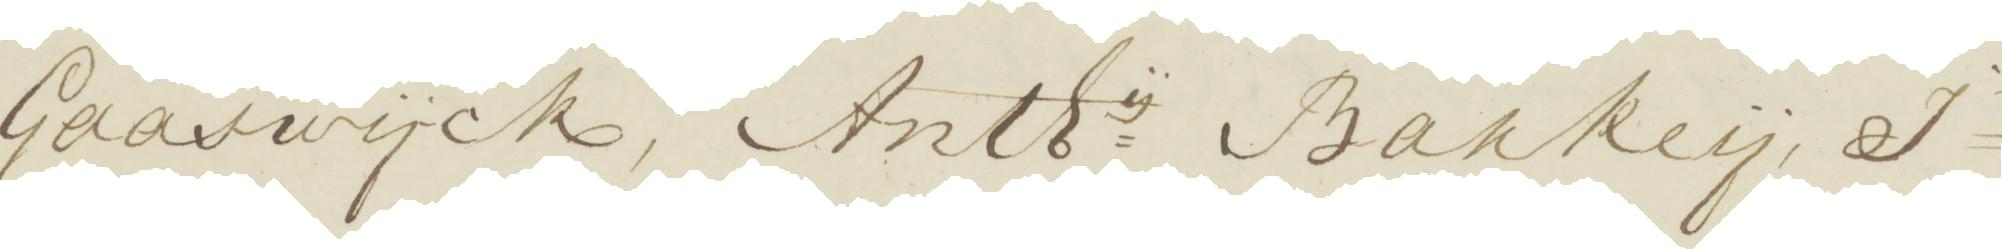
Gaaswijck, Anth=ij Barkeij, J=n
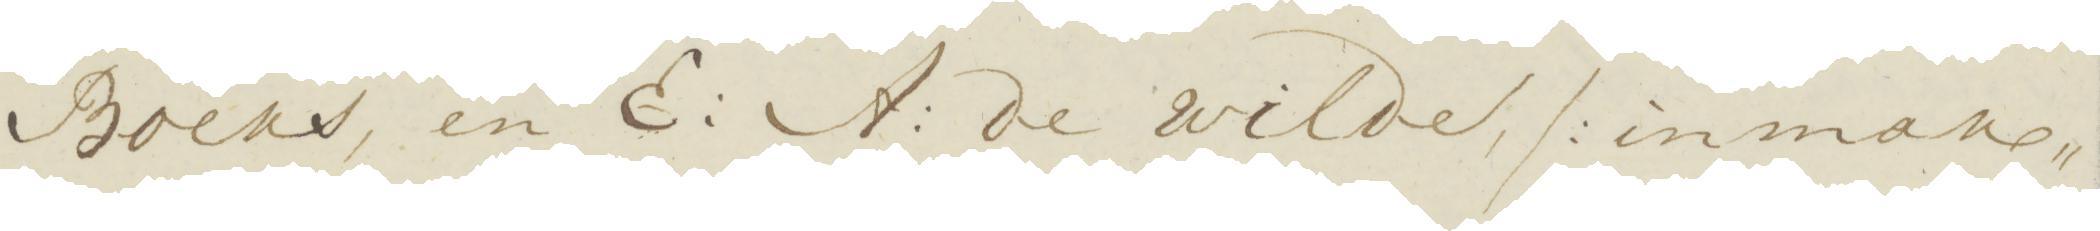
Boers, en E: A: de wilde, /:in mar„
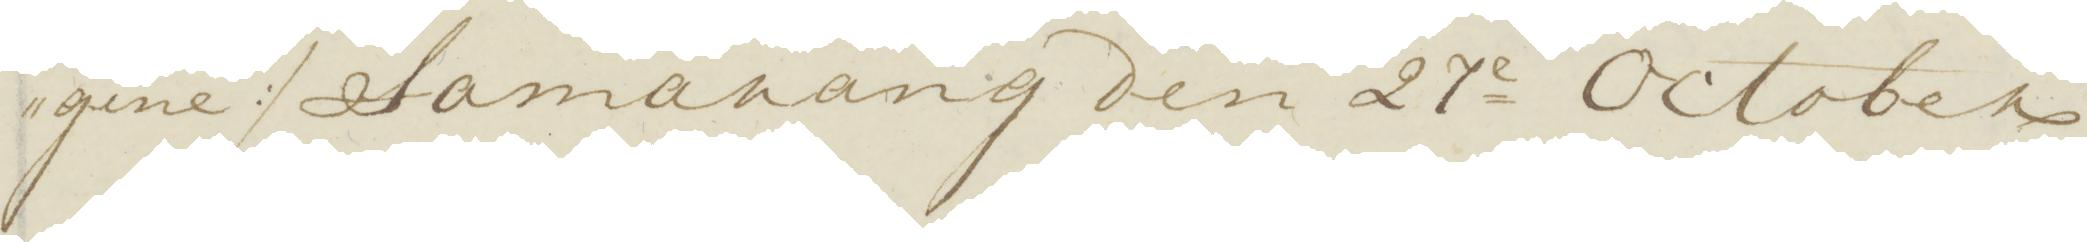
„gine:/ Samarang den 27=e October
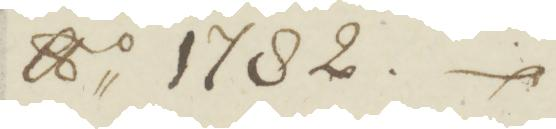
A„o 1782. —
